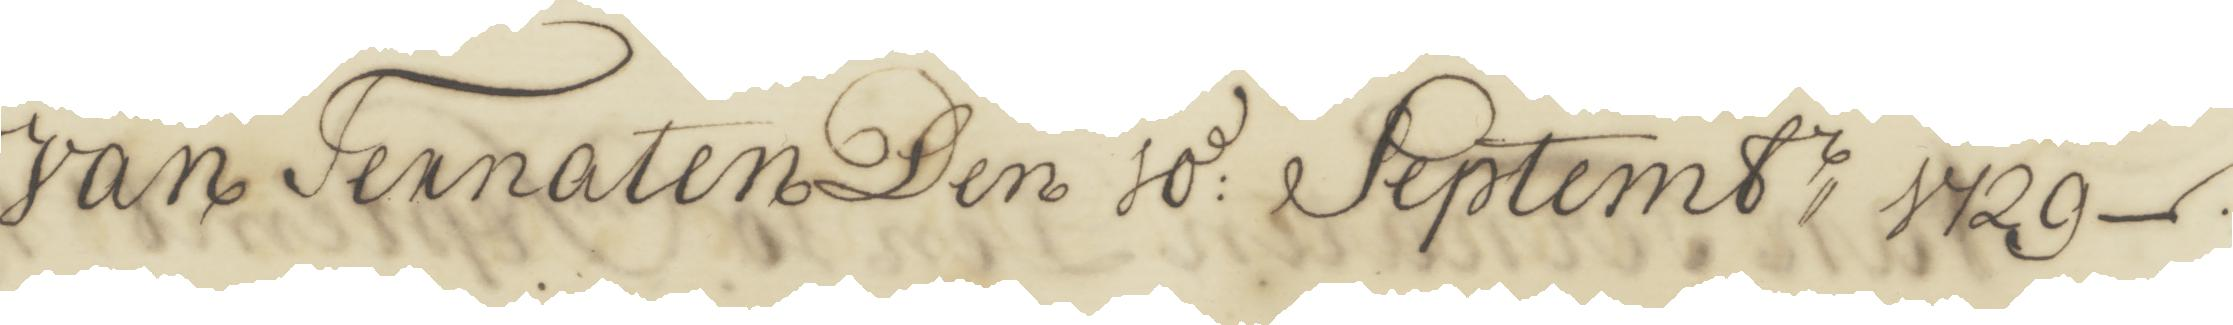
Van Ternaten Den 10:e Septemb„r 1729 —
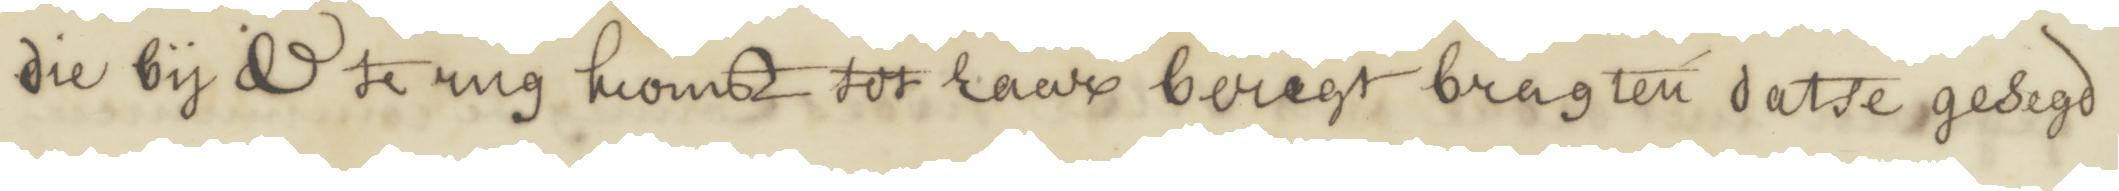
die bij de terug komst tot haar berigt bragten datse gesegd
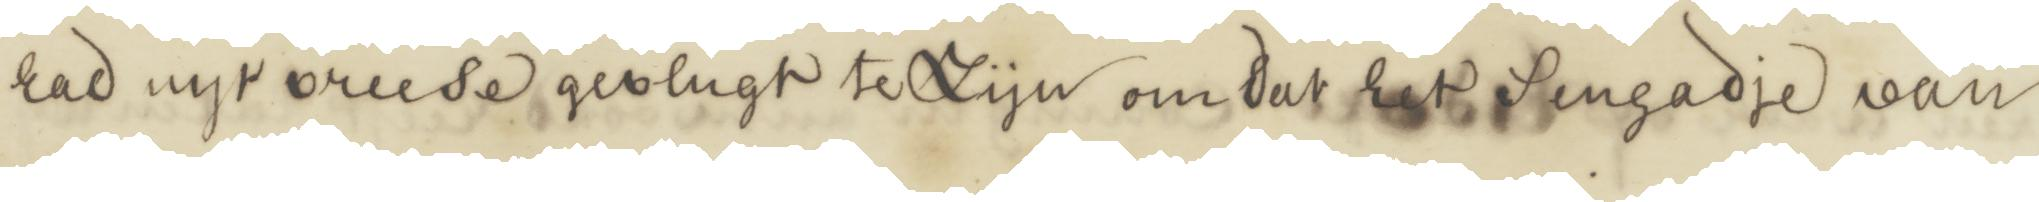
had uyt vreese gevlugt te Zijn om dat het sengadje van
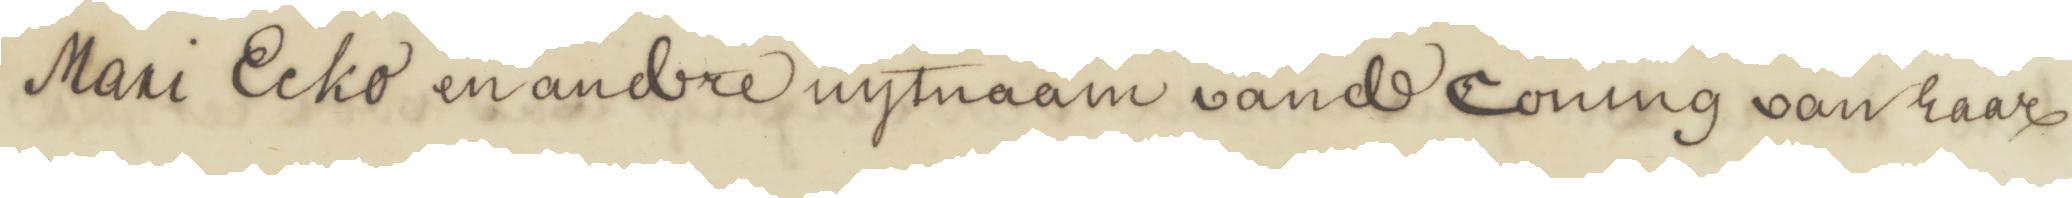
Mari Ecko en andere uijtnaam vande Coning van haar
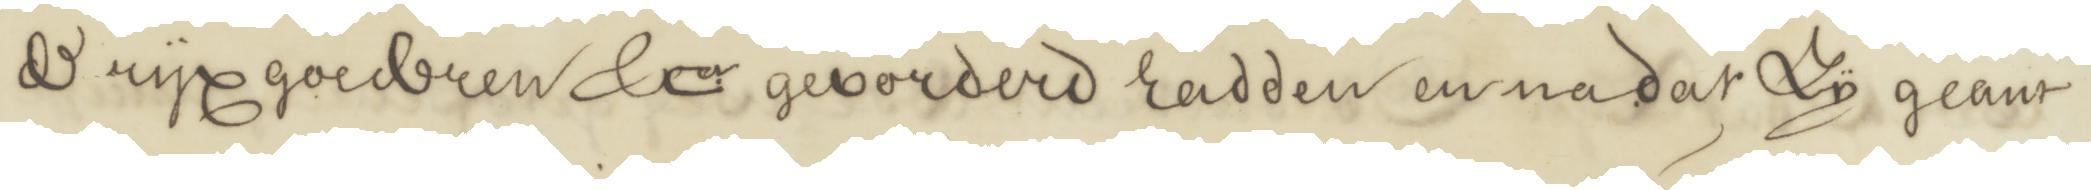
de rijx goederen &:ca gevorderd hadden en na dat Zij geant
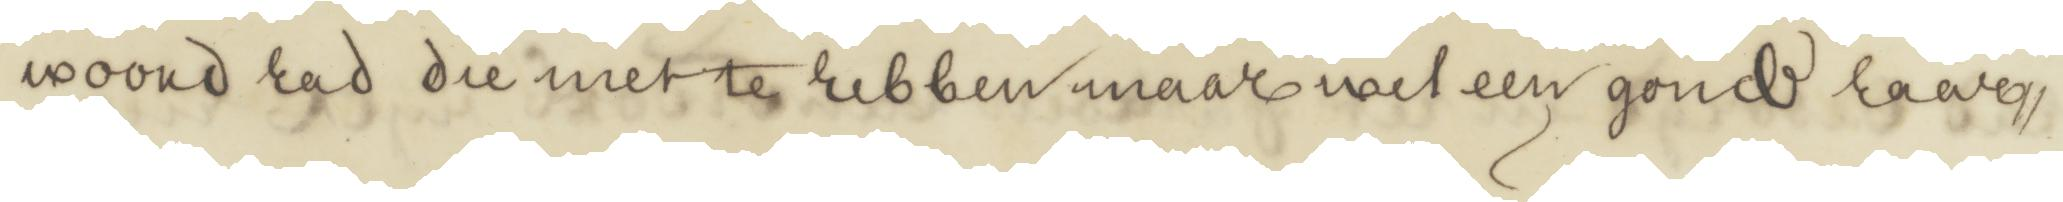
woord had die niet te hebben maar wel een goude haar„
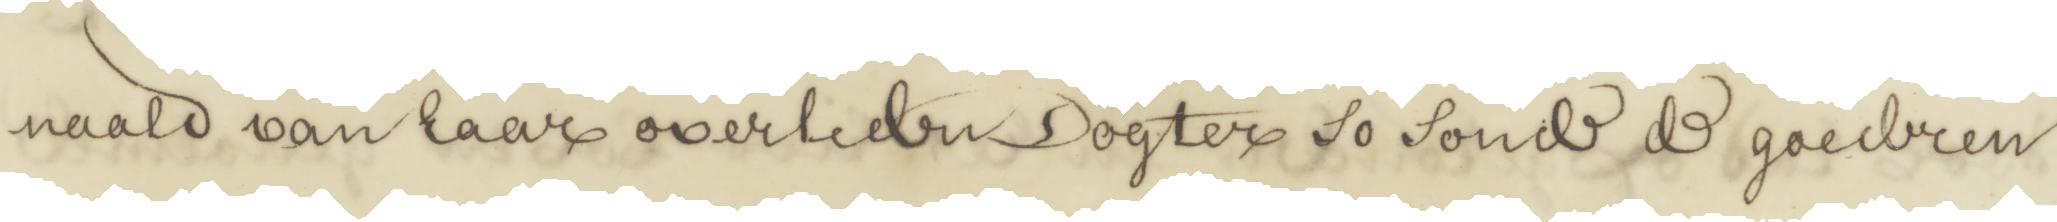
naald van haar overleden Dogter so soude de goederen
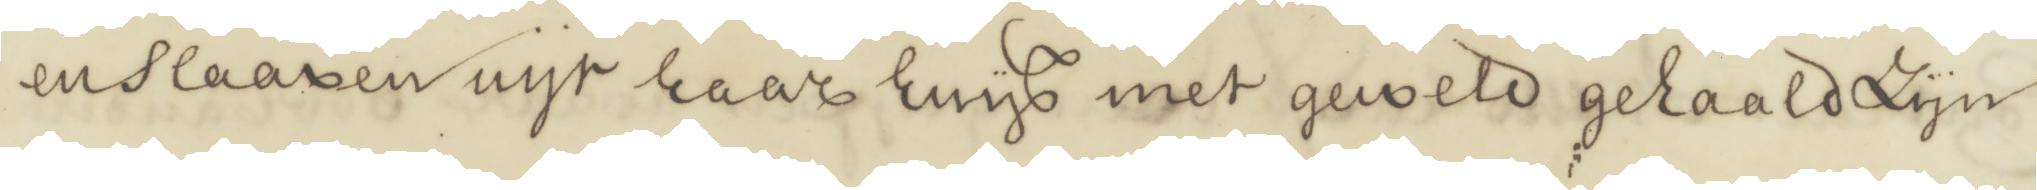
en slaaven uijt haar huijs met geweld gehaald Zijn
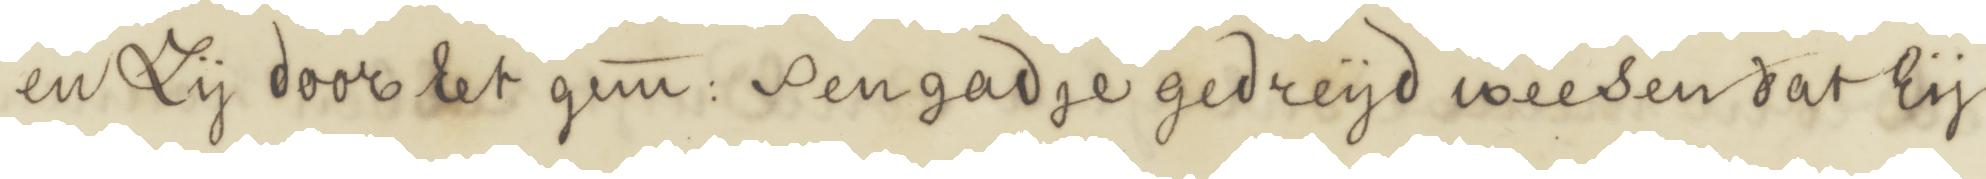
en Zij door het gem: sengadje gedreijd weesen dat hij
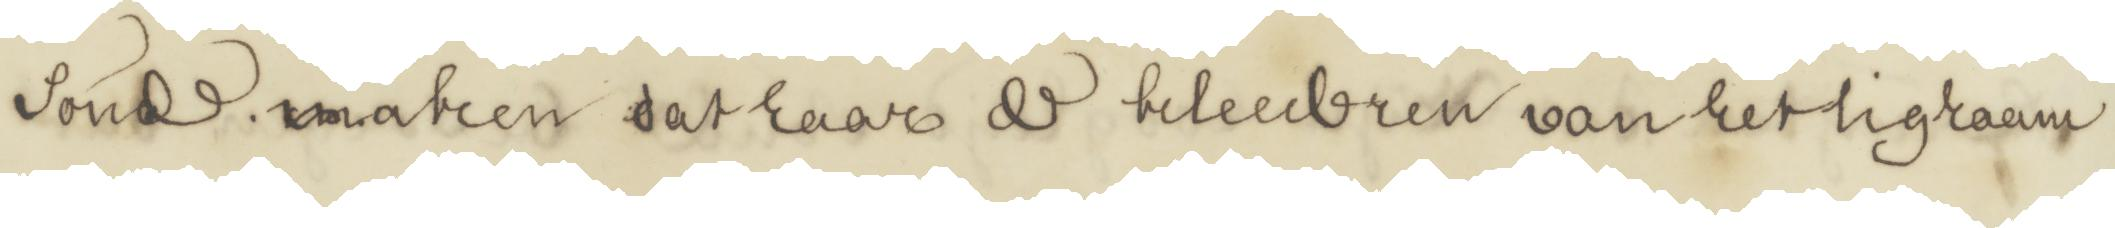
Soude maken dat haar de kleederen van het lighaam
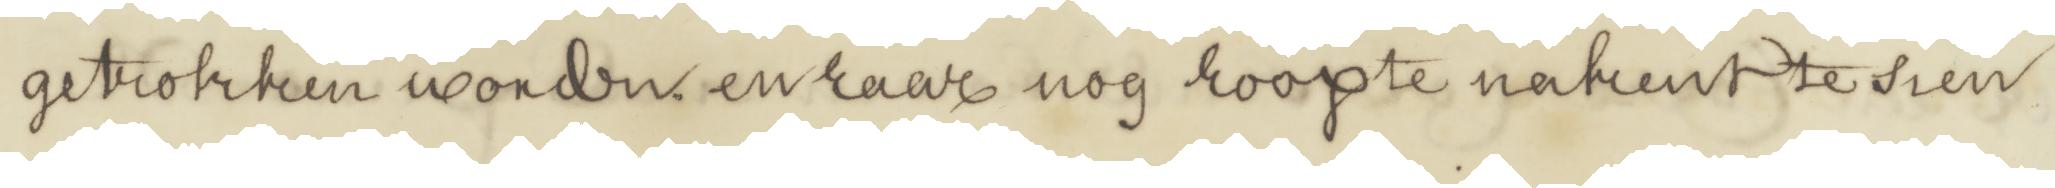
getrokken worden en haar nog hoopte nakent te sien
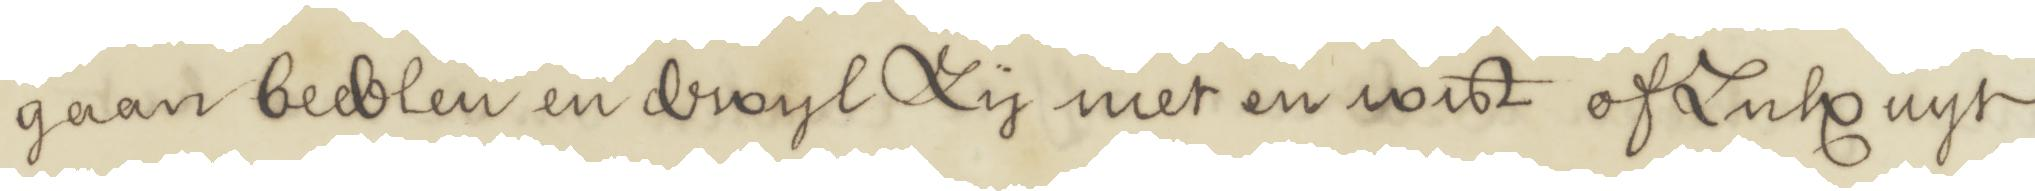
gaan bedelen en dewyl Zij niet en wist of Zulx uyt
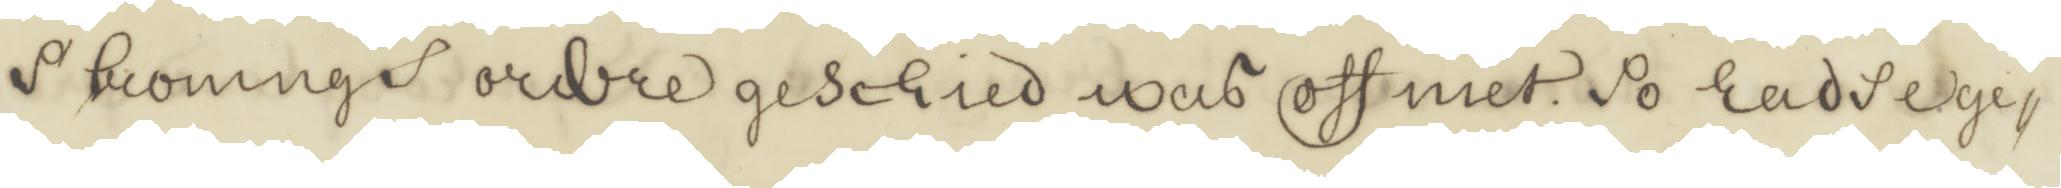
S' konings ordere geschied was off niet So had Se ge„
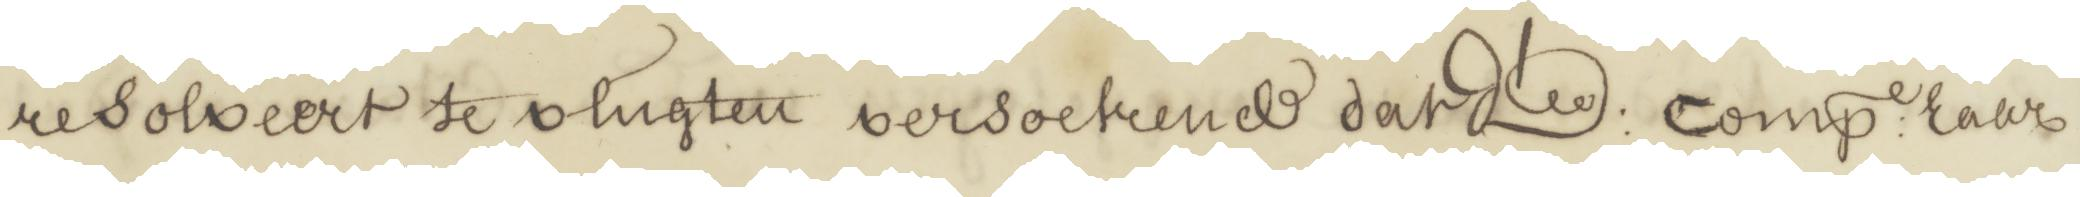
resolveert te vlugten versoekende dat d'E: Comp:e haar
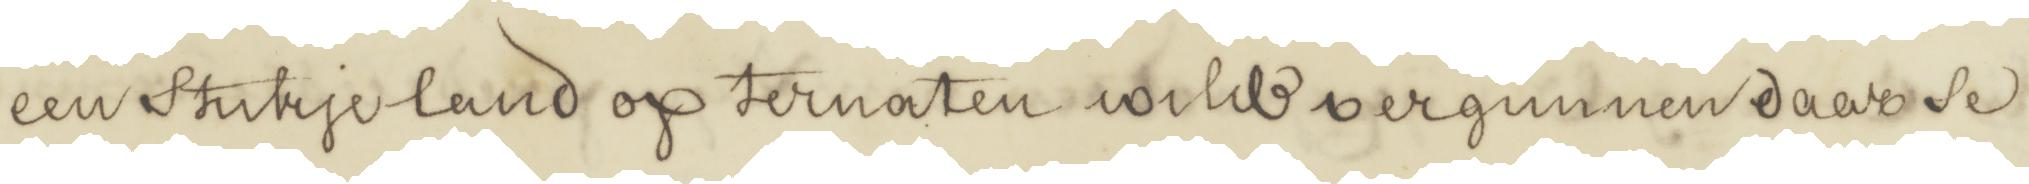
een Stukje land op ternaten wilde vergunnen daar se
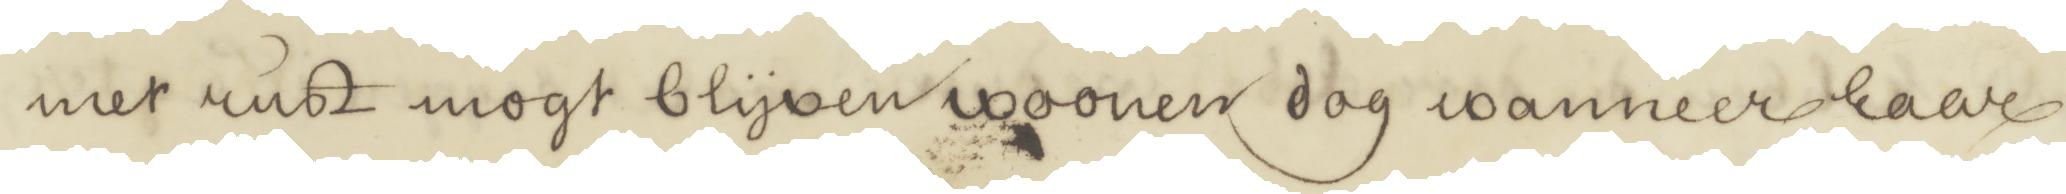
met rust mogt blijven woonen dog wanneer haar
